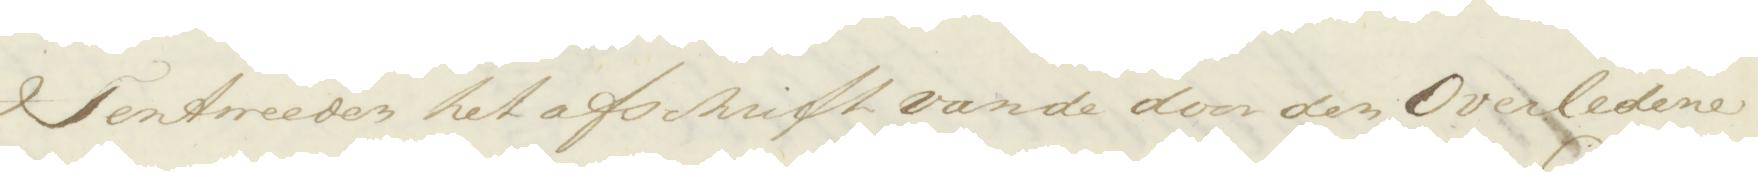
Ten tweeden het afschrift van de door den Overledene
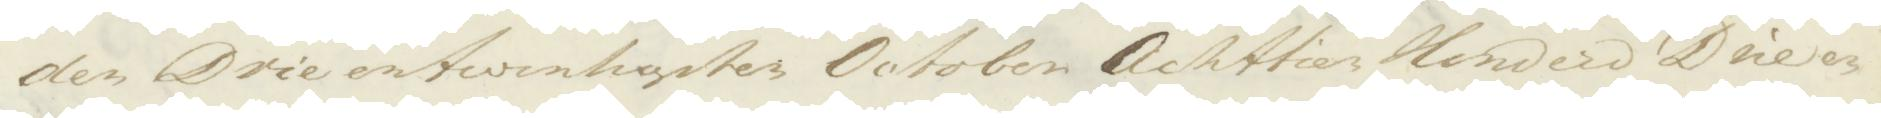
den Drie en twintigsten October Achttien Honderd Drie en
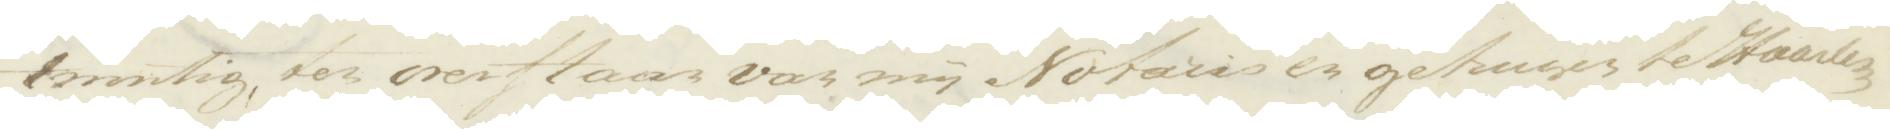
twintig, ten overstaan van mij Notaris en getuigen te Haarlem
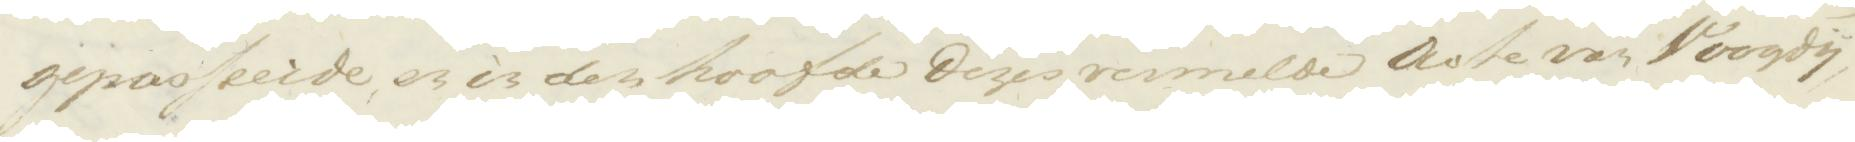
gepasseerde, en in den hoofde dezes vermelde Acte van Voogdij,
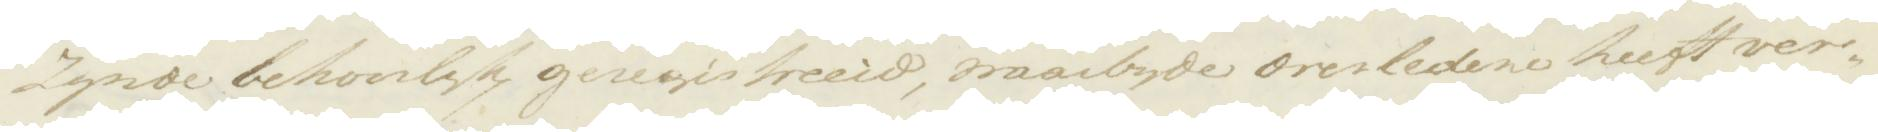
zynde behoorlyk geregistreerd, waarby de overledene heeft ver„
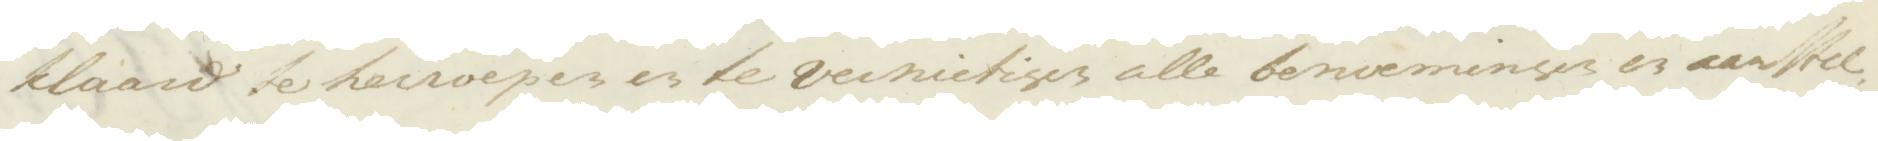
klaard te herroepen en te vernietigen alle benoemingen en aanstel„
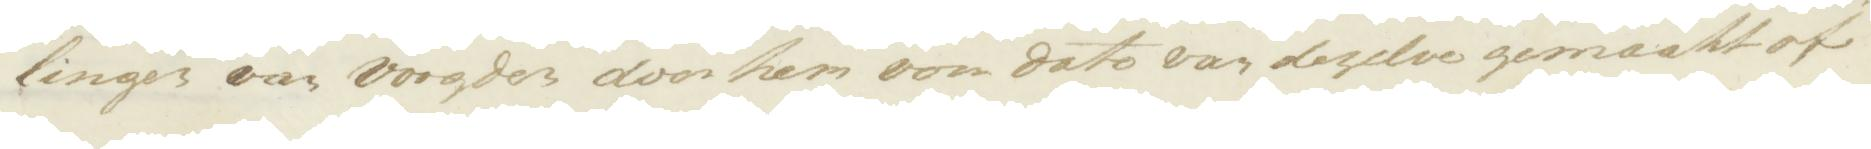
lingen van voogden door hem voor dato van dezelve gemaakt of
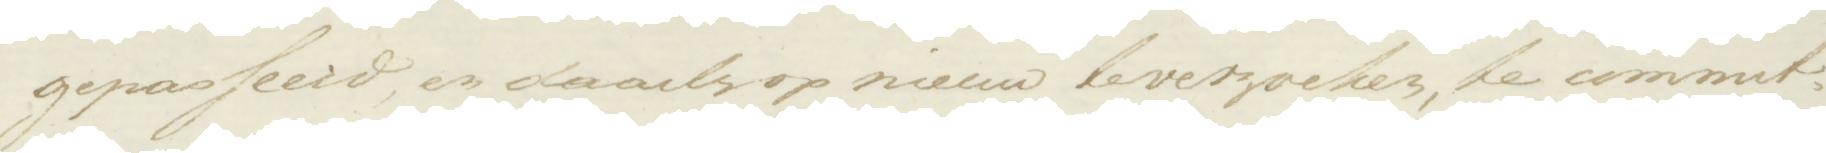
gepasseerd, en daarby op nieuw te verzoeken, te commit
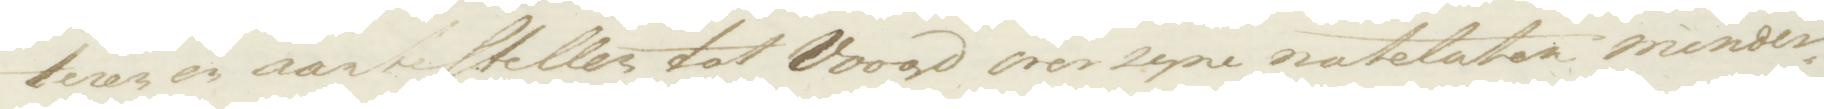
teren en aan testellen tot voogd over zyne natelaten minder„
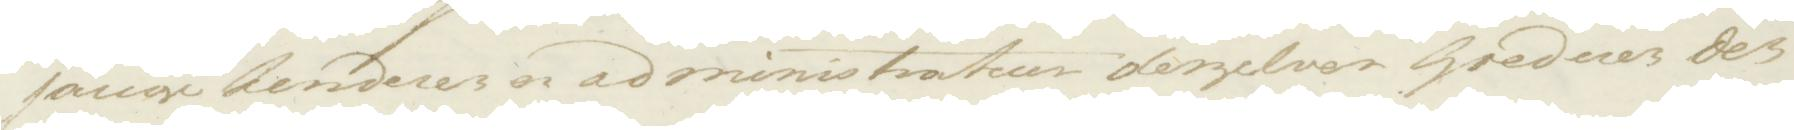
jarige kinderen en administrateur derzelver Goederen der
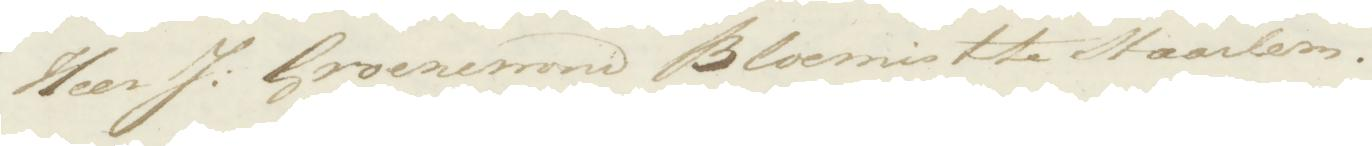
Heer J: Groenewond Bloemistte Haarlem.
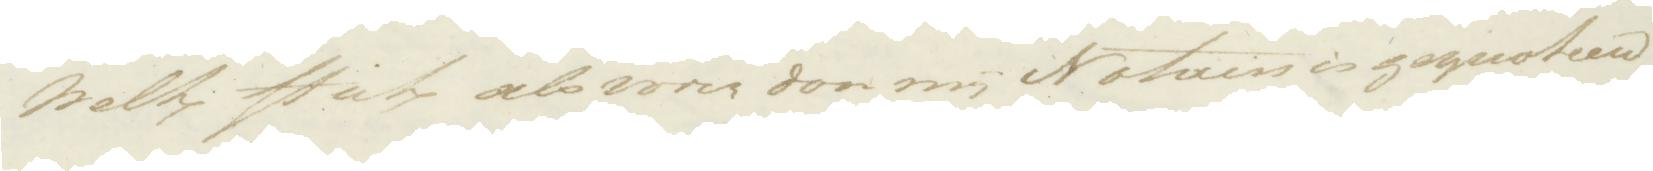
welk stuk als voren door mij Notaris is gequoteerd
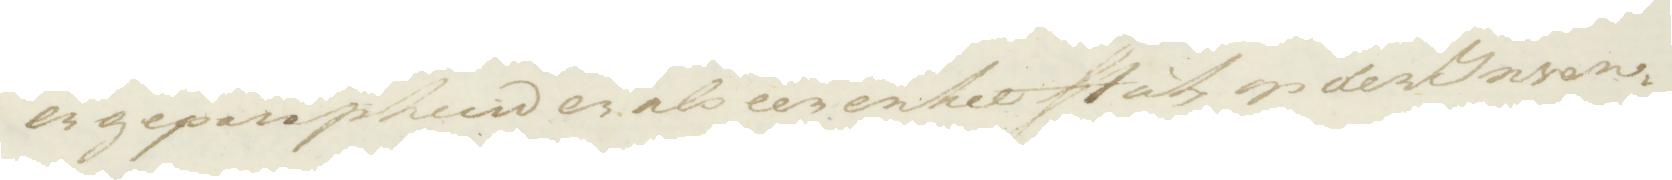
en geparapheerd en als een enkel stuk op den Inven:
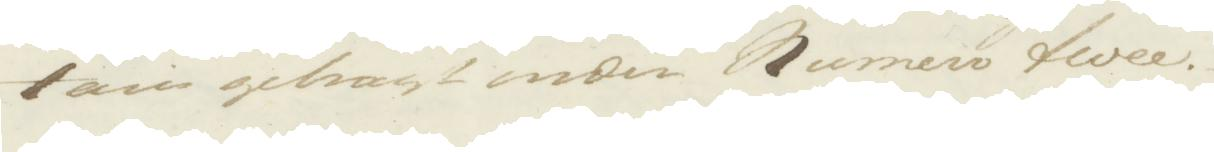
taris getragt onder Numero twee.
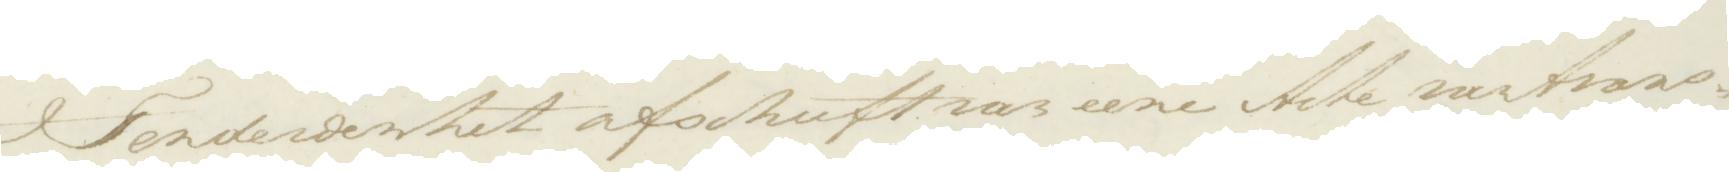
Ten derden het afschrift van eene Acte van trans
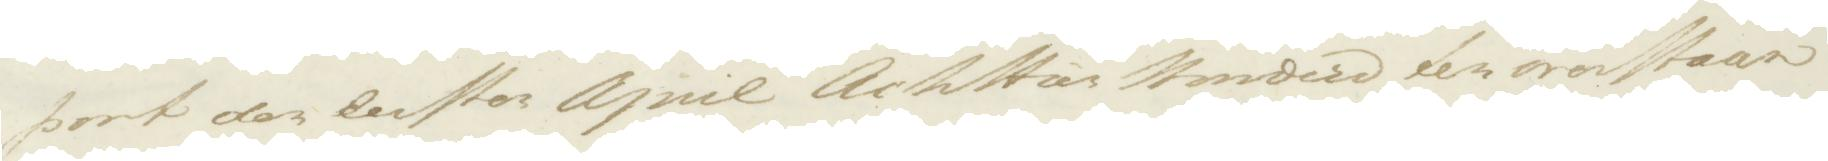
port den Eersten April achttien Honderd ten overstaan
